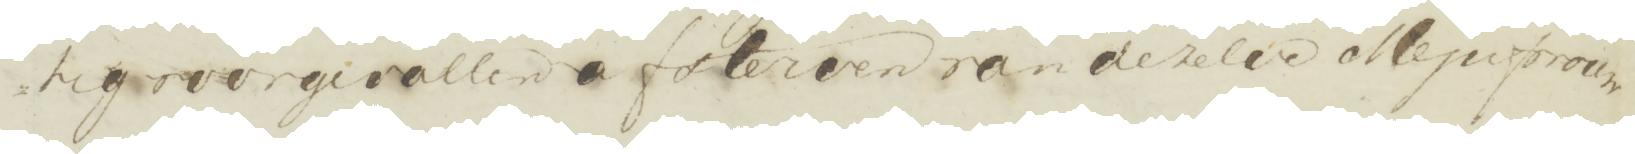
=tig voorgevallen afsterven van dezelve Mejufvrouw
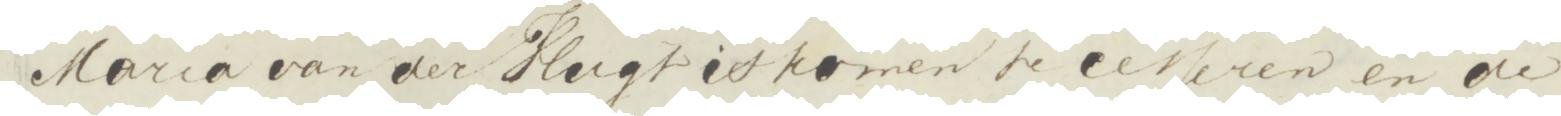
Maria van der Vlugt is komen te cesseren en de
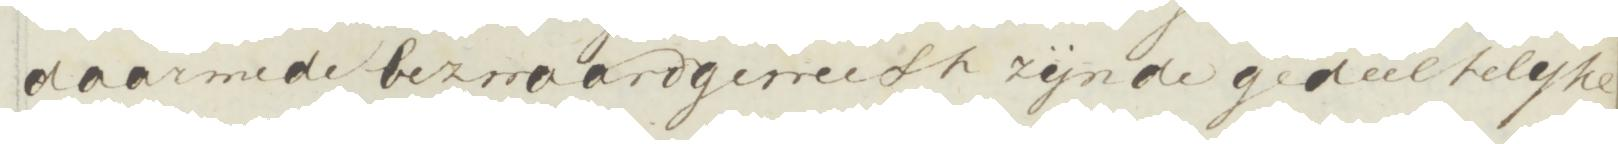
daarmede bezwaard geweest zijnde gedeeltelyke
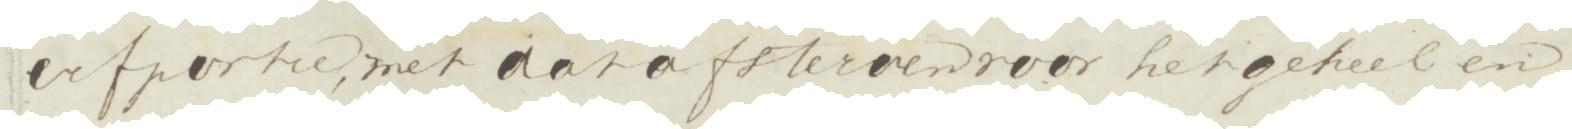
erfportie, met dat afsterven voor het geheel en
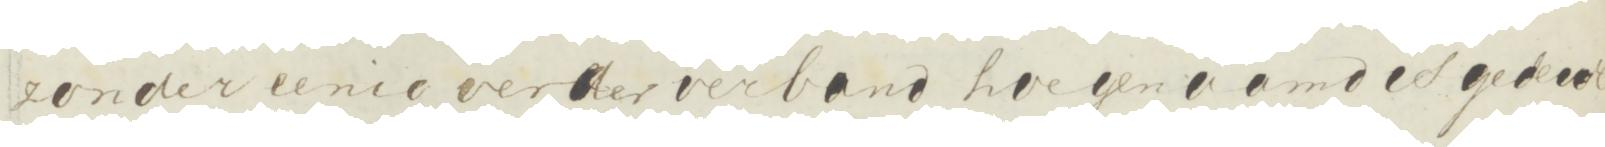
zonder eenig verder verband hoegenaand is gedecer
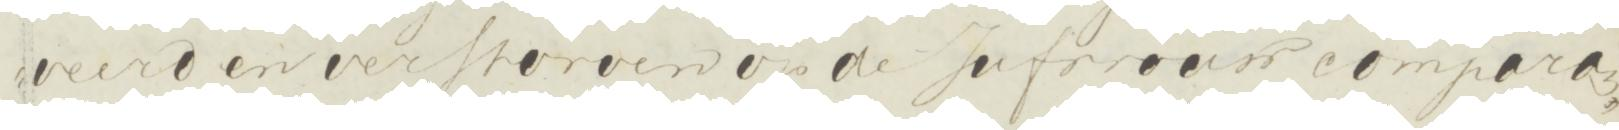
„veerd en verstorven op de Jufvrouw comparan
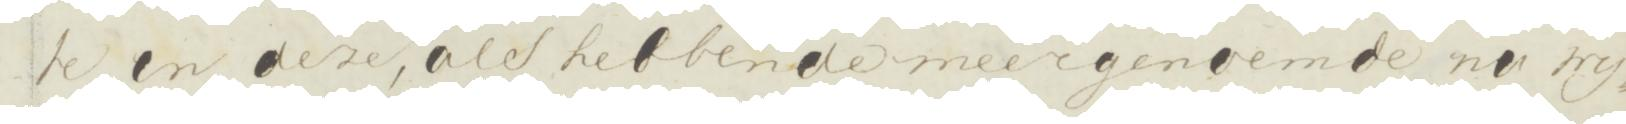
te en deze, als hebbende meergenoemde nu wy
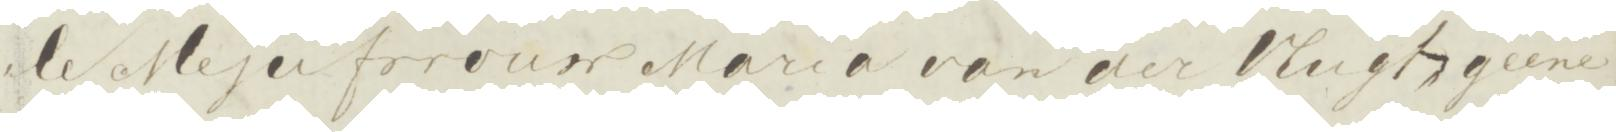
le Mejufvrouw Maria van der Vlugt, geene
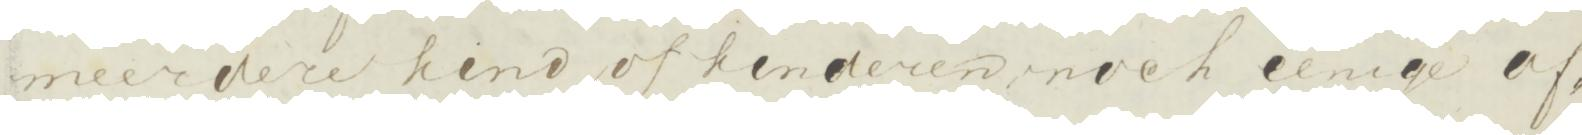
meerdere kind, of kinderen, noch eenige af
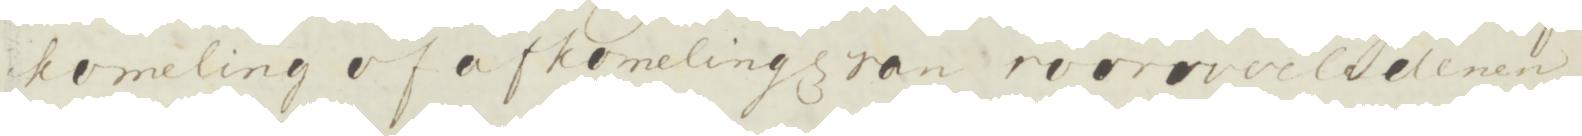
komeling of afkomelingen van vooroverledenen
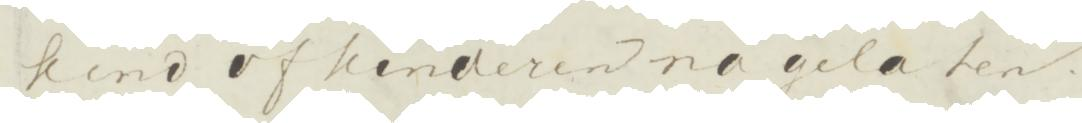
kind of kinderen na gelaten
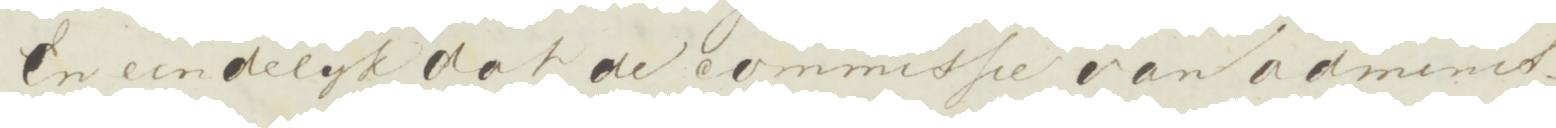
En eindelyk dat de commissie van adminis
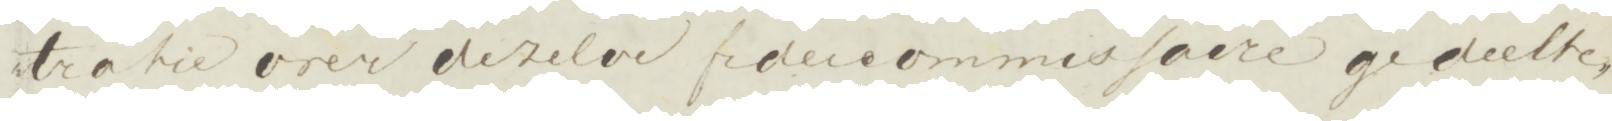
tratie over dezelve fideicommissaire gedeelte
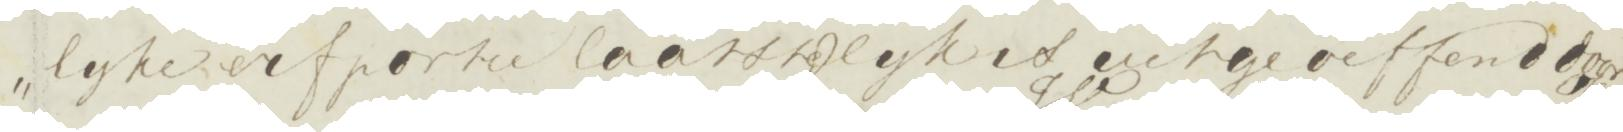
„lyke erfportie laatstelyk is uitgeoeffend door
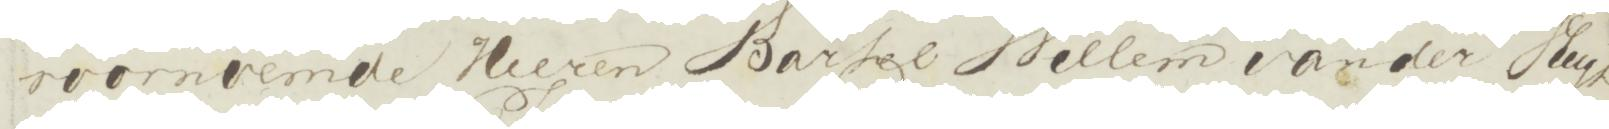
voornoemde Heeren Bartel Willem van der Vlugt
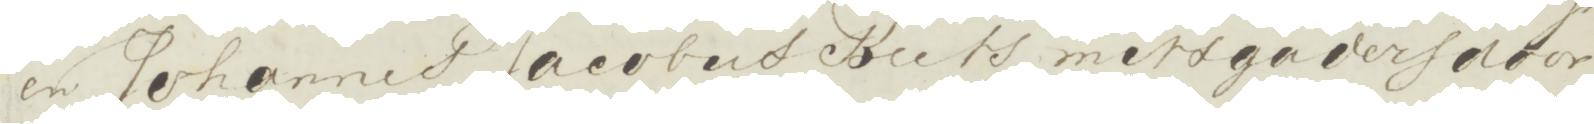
en Johannes Jacobus Beets mitsgaders door
